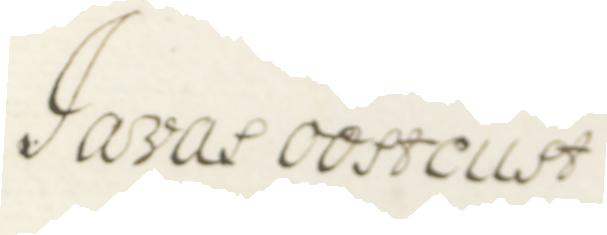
Javas oostcust
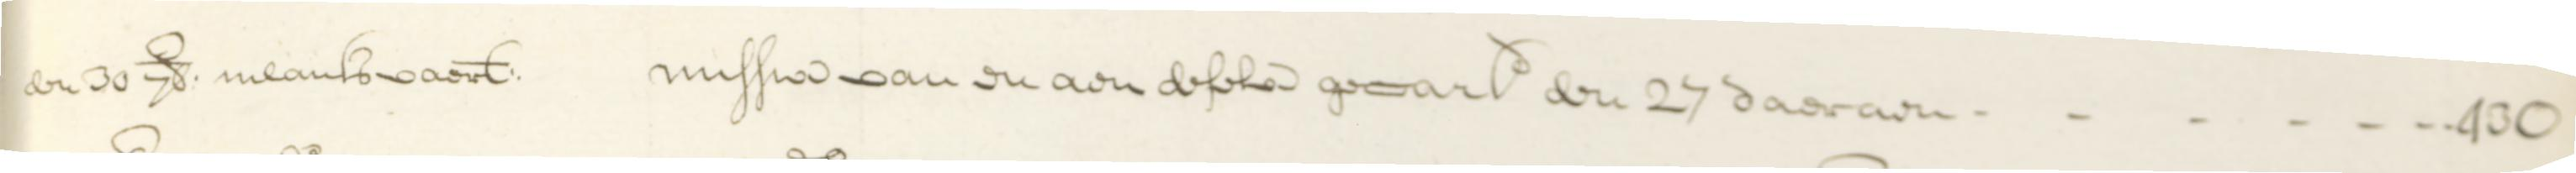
den 30 7b: inlants vaert: missive van en aen deselve gecartd den 27 daeraen . . . . . . . 430
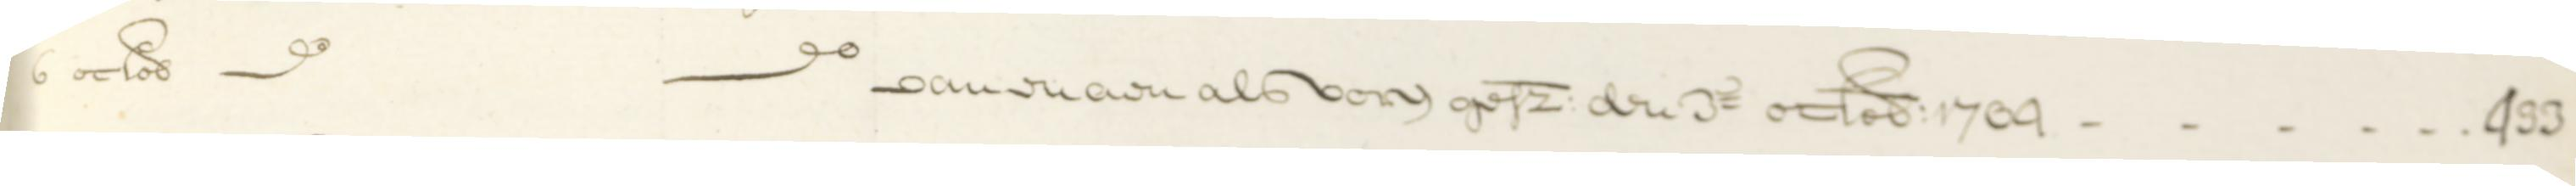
6 octob _o _o van en aen als voren gesz: den 3=' octob: 1704 . . . . . . 433
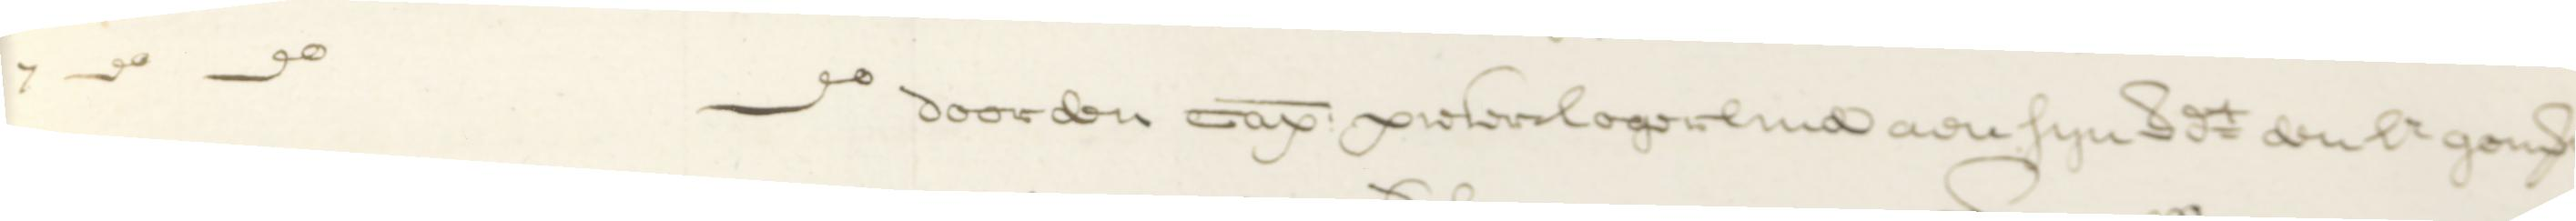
7 _o _o _o door den cap: pieter hogerlinde aen sijn Ed=t den hr gouver
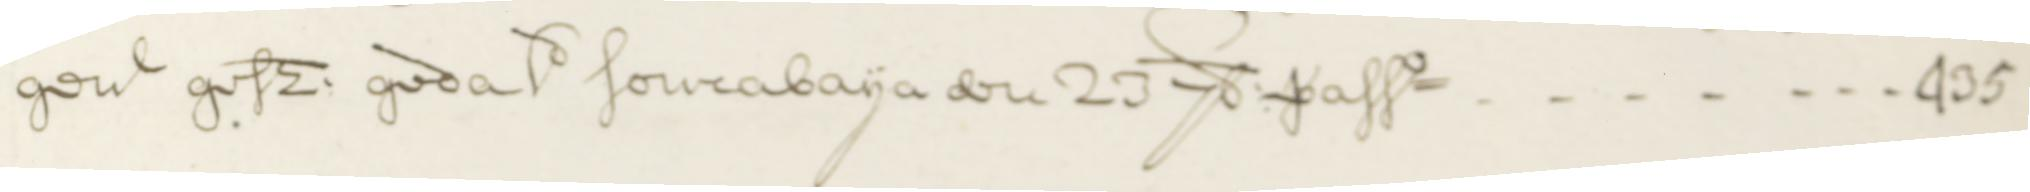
genl gesz: gedatd sourabaija den 23 7b: pass=o . . . . . . . 435
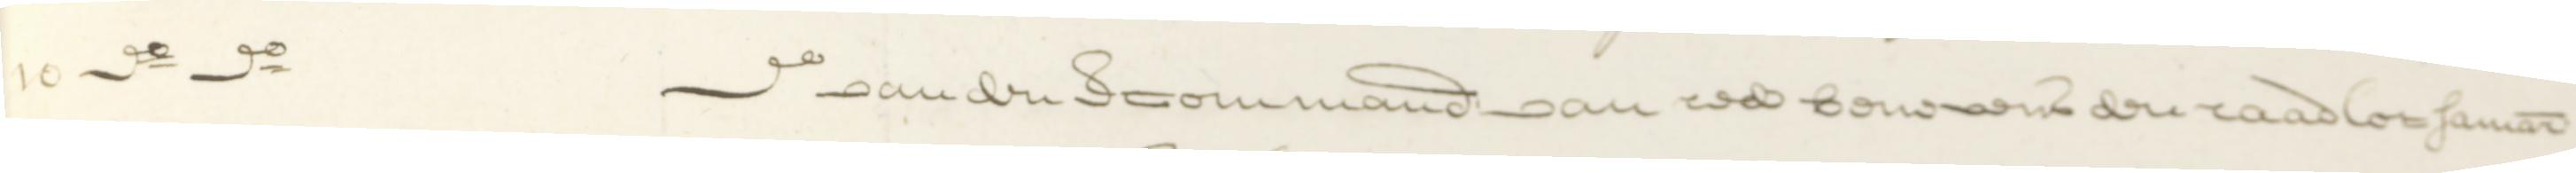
10 _=o _=o _o van den Ecommand van rede benevens den raad tot samar
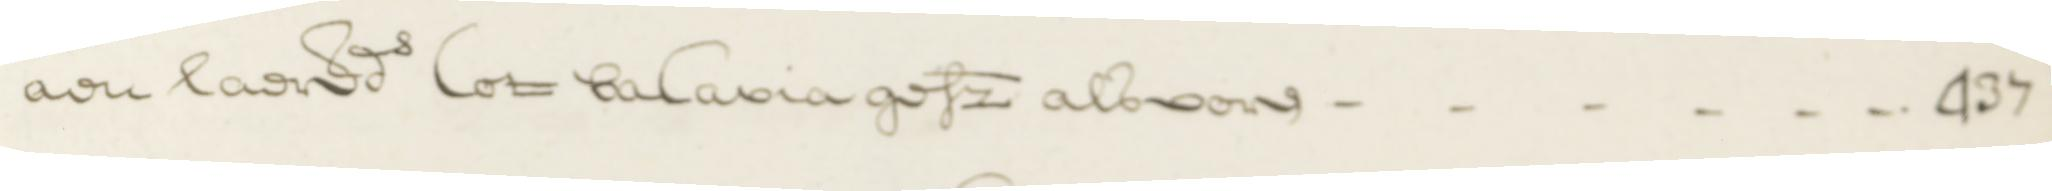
aen haer Eds tot batavia gesz alsvoren . . . . . . . 437
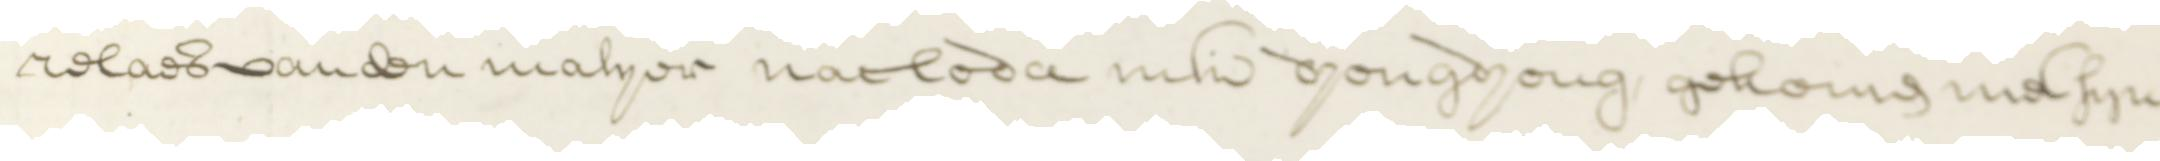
relaes van den malyer nachoda inke djongdjong, gekomen met sijn
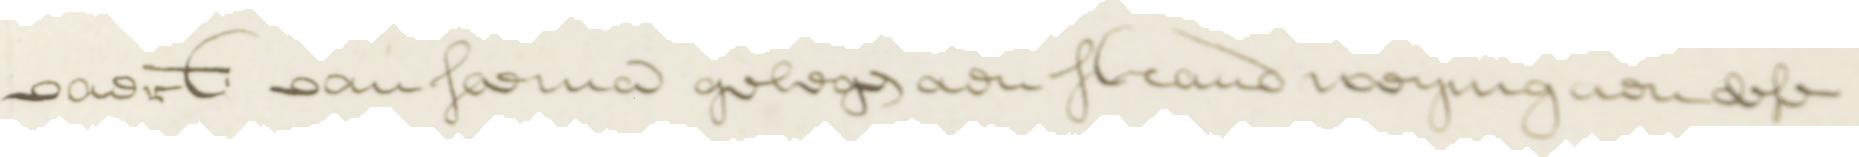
vaert van soema gelegen aen strand weynig aen dese
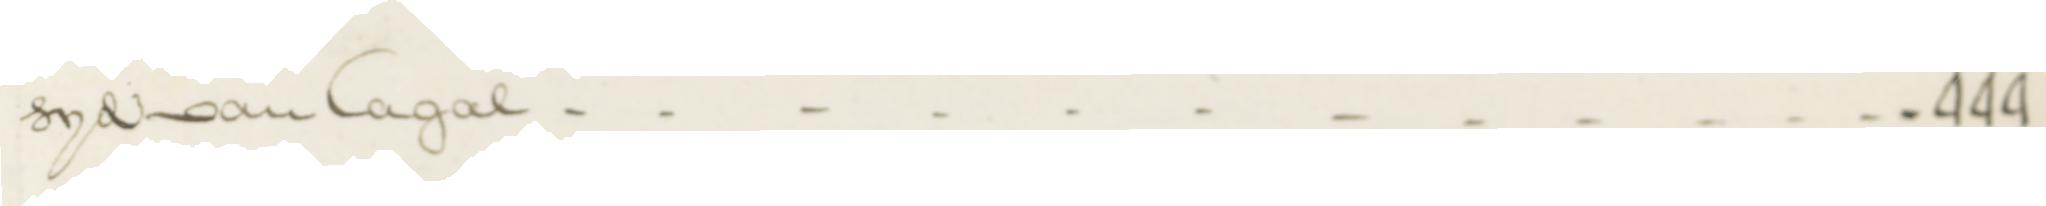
syde van tagal . . . . . . . . . . . . . 444
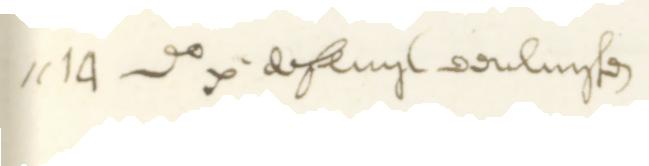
„ 14 _o pr de sluyt een huysen
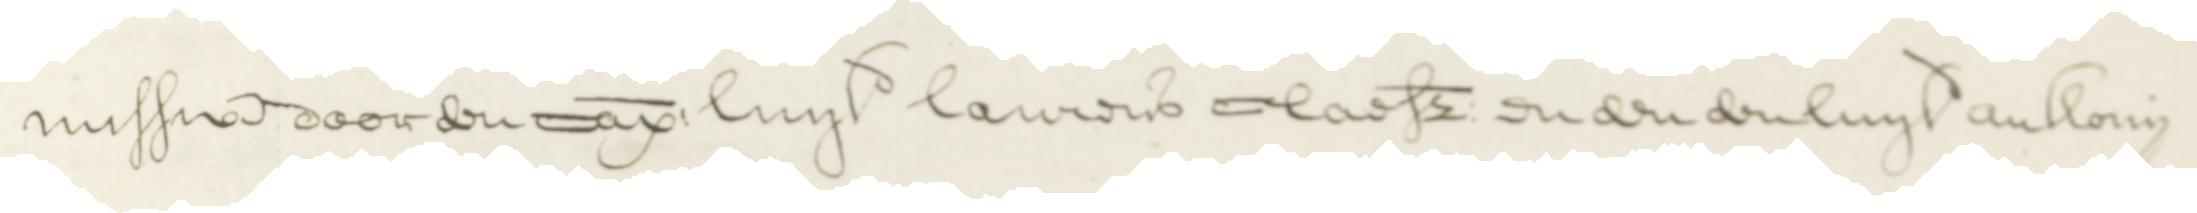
missive door den cap: luytd laurens claesz: en den den luytd anthonij
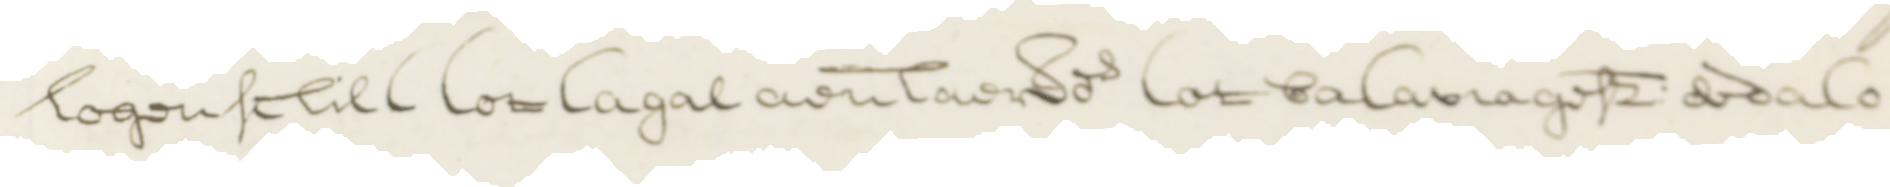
hogenschilt tot tagal aen haer Eds tot batavia gesz: de dato
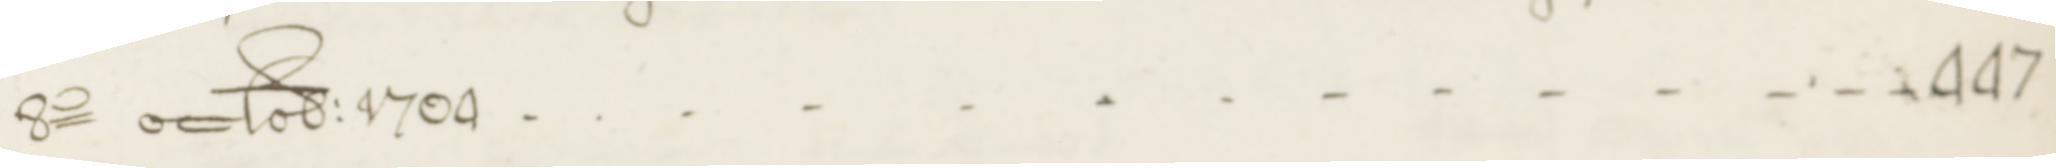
8=' octob: 1704 . . . . . . . . . . . . . . 447
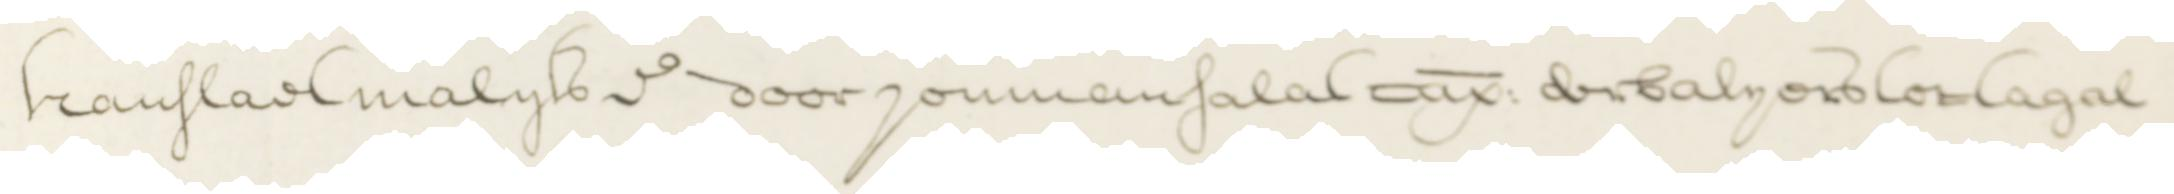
translaet malijts do door joumansalas cap: der balyers tot tagal
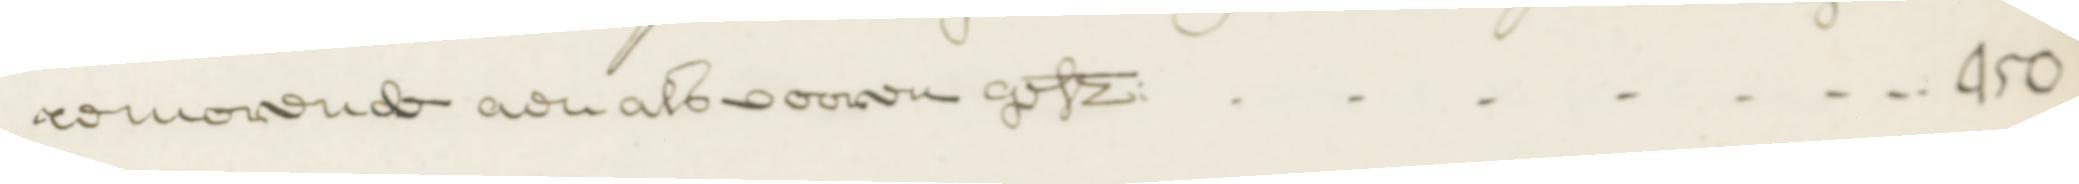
remorende aen als vooren gesz: . . . . . . . . 450
